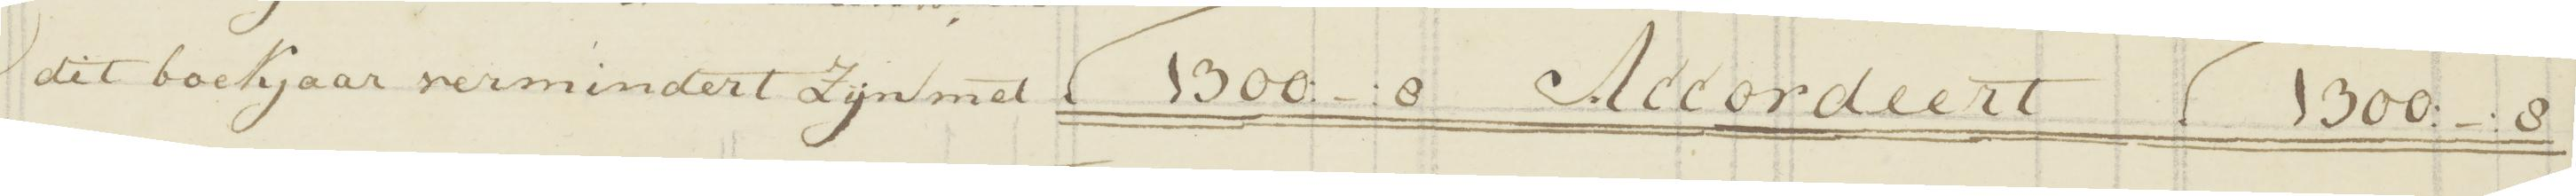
dit boekjaar vermindert zijn met ƒ 1300:–: 8 Accordeert ƒ 1300:–:8
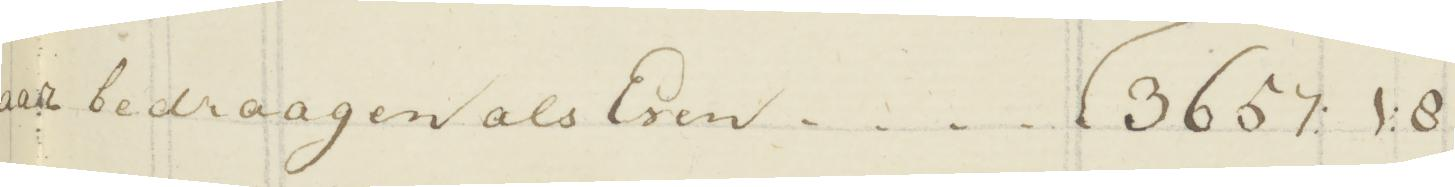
ar bedraagen als Even - - - - ƒ 3657: 1:8
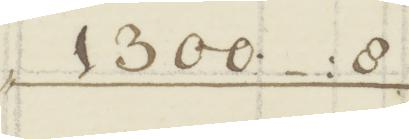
1300:–:8
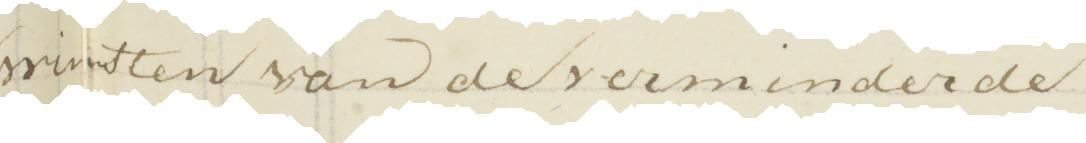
winsten van de verminderde
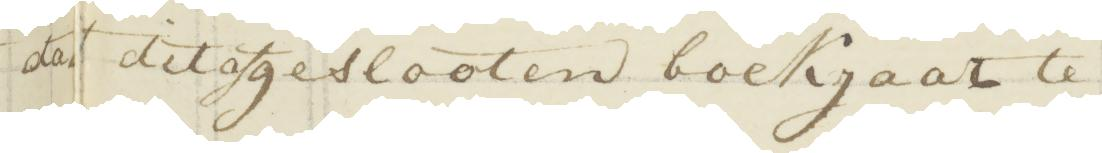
dat dit afgeslooten boekjaar te
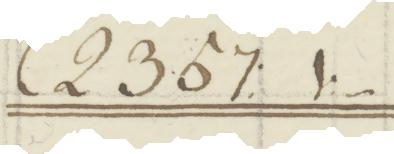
ƒ2357: 1:–
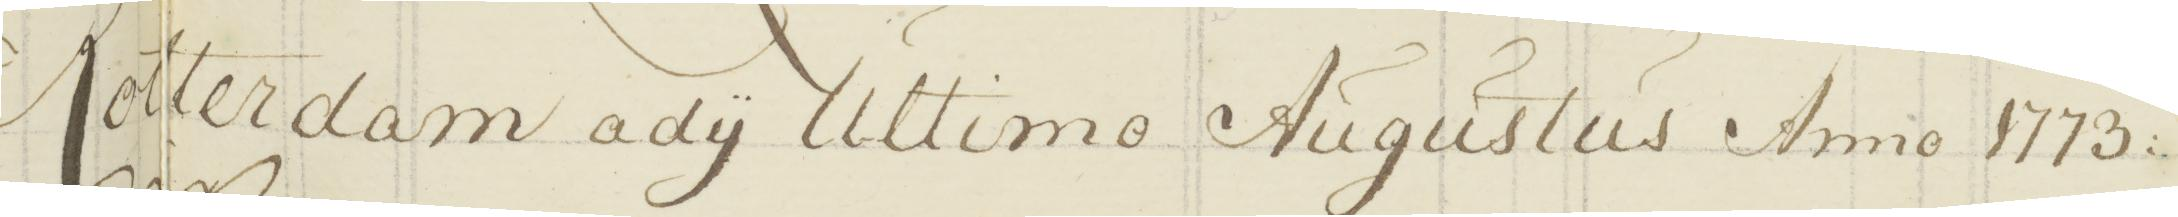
Rotterdam adij Ultimo Augustus Anno 1773:
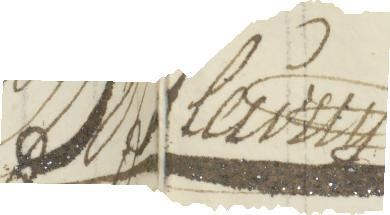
B„s V: Ileuruy
